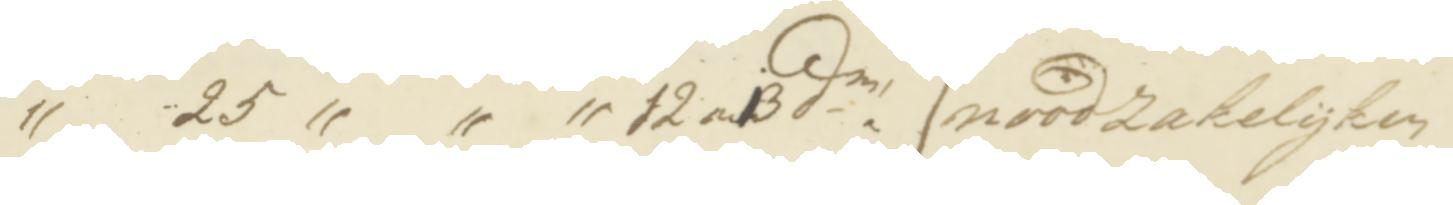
„ 25 „ „ „ 12a 13 d=m noodzakelijken
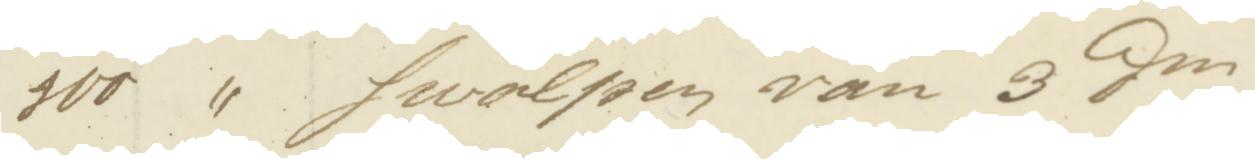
100 „ swolpen van 3 dm
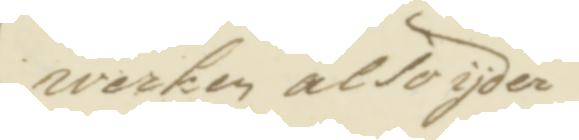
werken also ijder
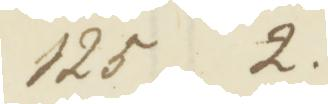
125 2.
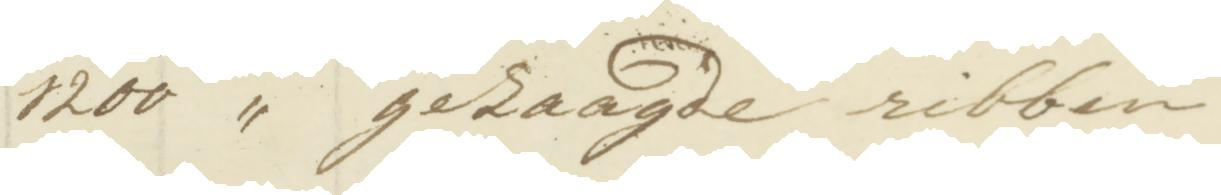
1200 „ gezaagde ribben
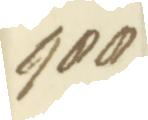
488
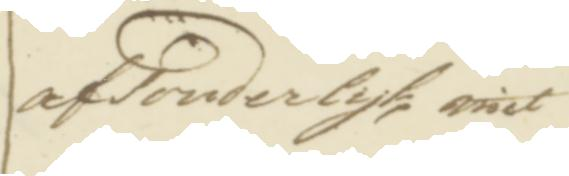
afsonderlijk niet
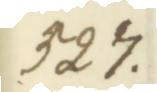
527.
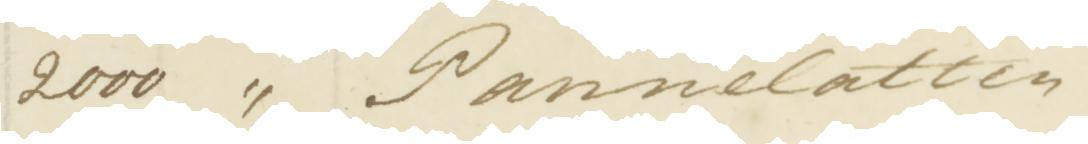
2000 „ Pannelatten
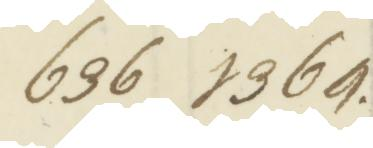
636 1364:
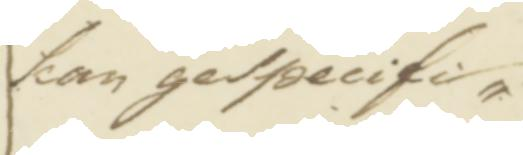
kan gespecifi„
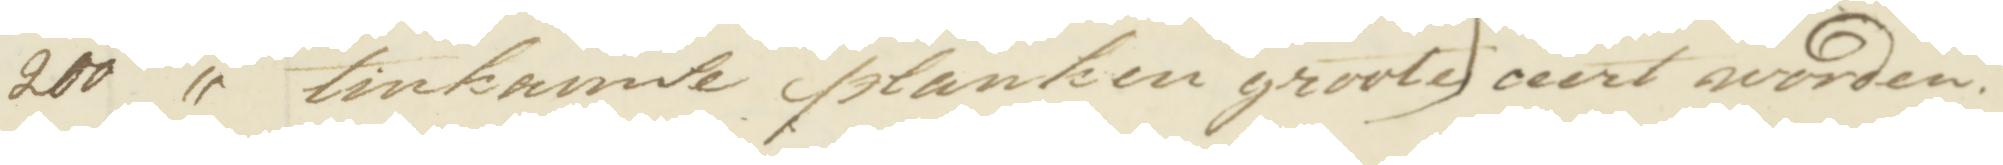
200 „ tinkamse planken groote ceert worden.
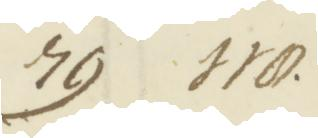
79 118.
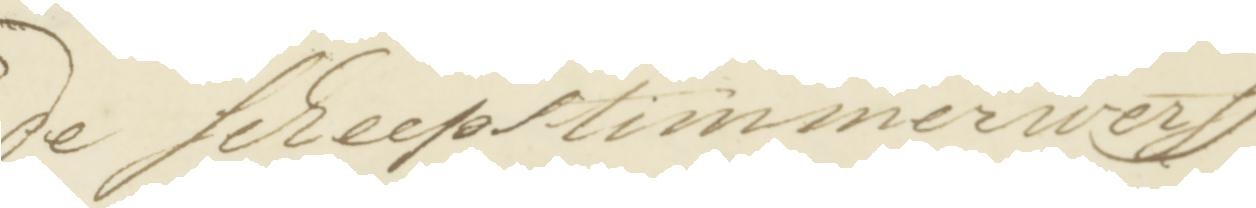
de scheepstimmerwerff
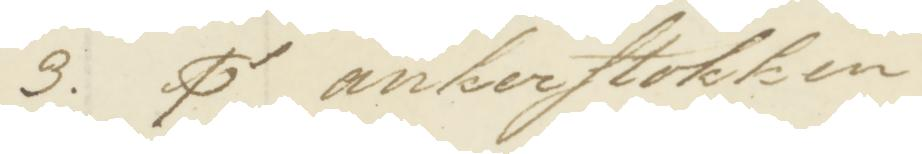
5. p:s ankerstokken
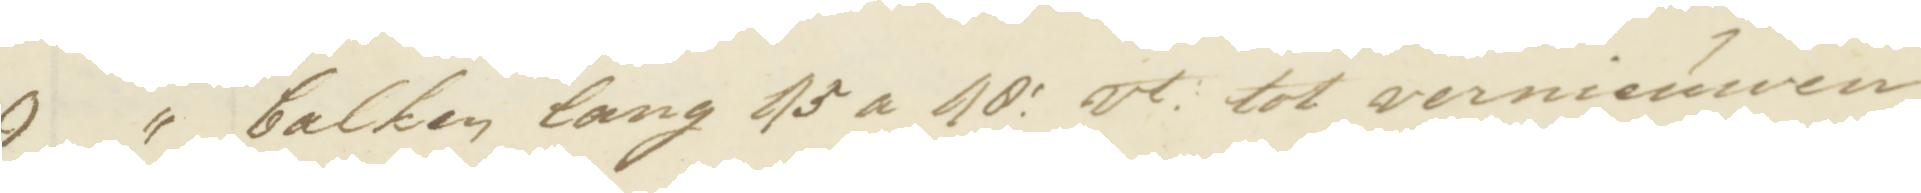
9„ balken lang 45 a 48: vt: tot vernieuwen
